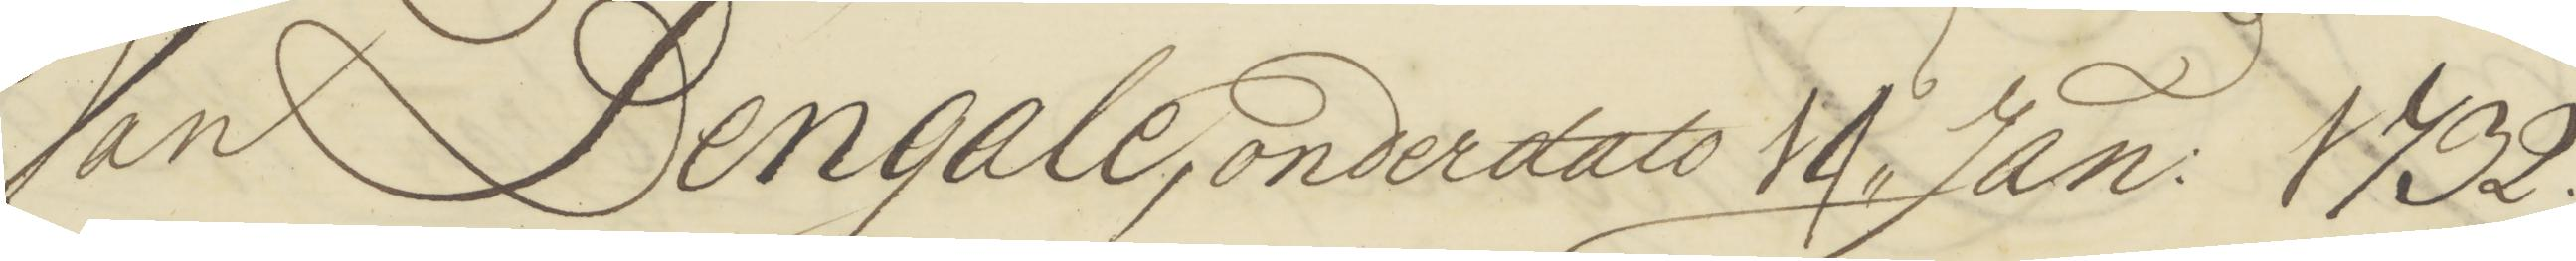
Van Bengale, onder dato 14„' Jan: 1732
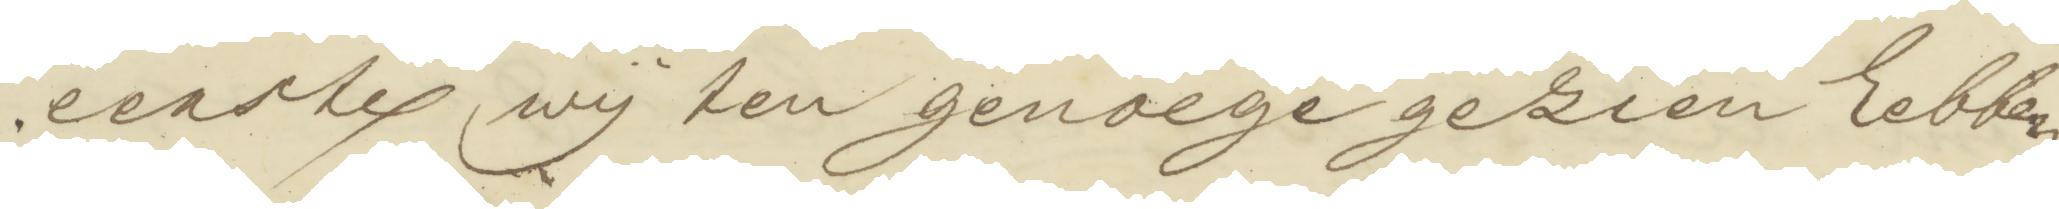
eerste wij ten genoege gezien hebbeN
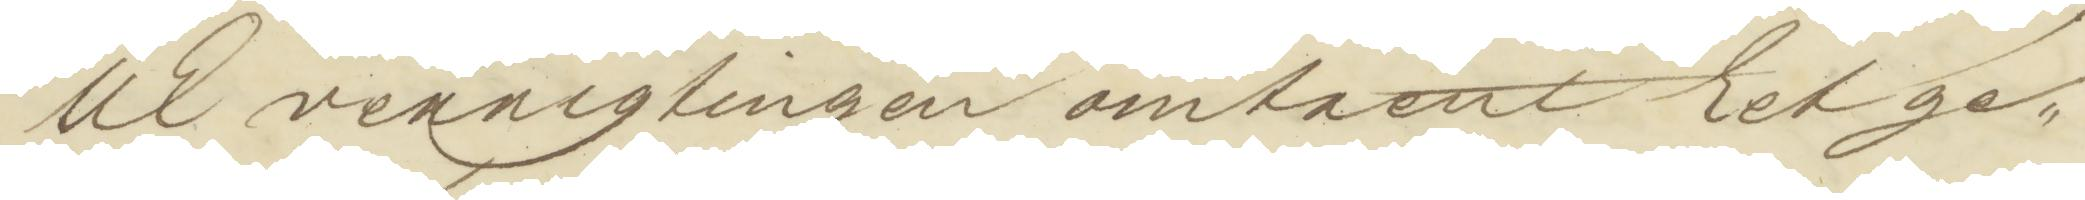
uE verrigtingen omtrent het ge„
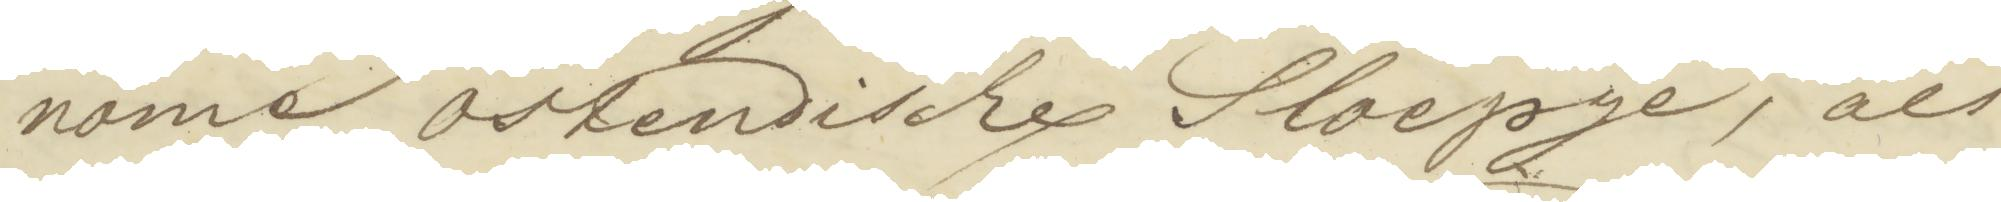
nome ostendische Sloepje, als
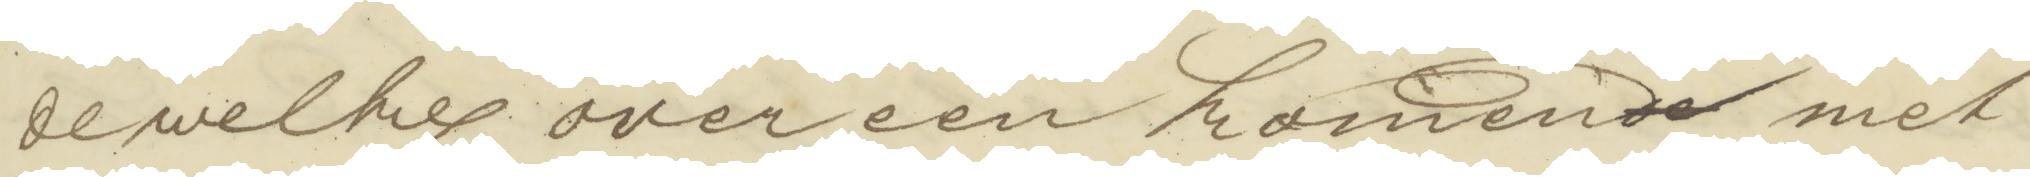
de welke over een komende met
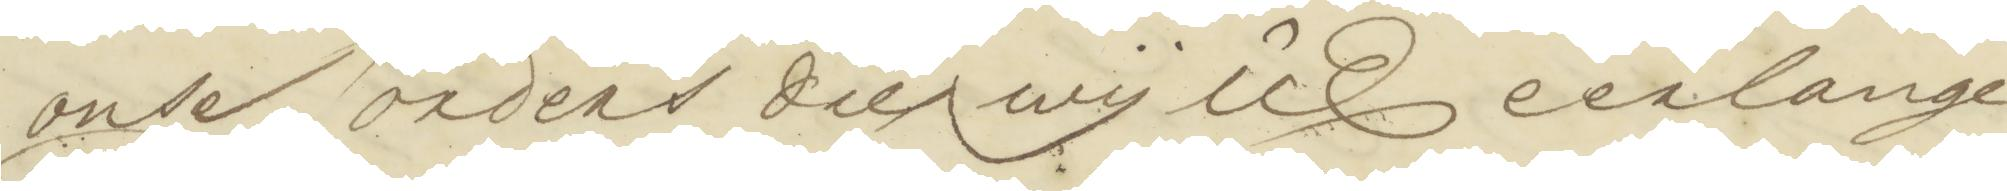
onse orders die wij UE eerlange
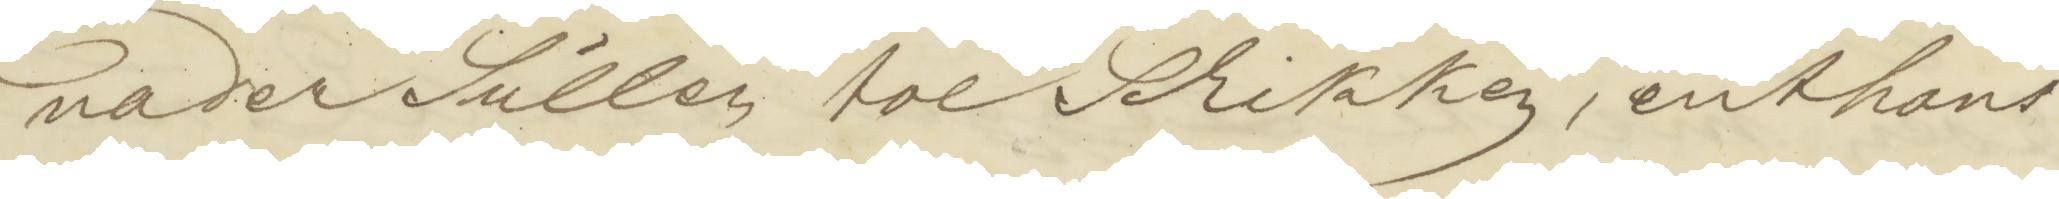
nader sullen toe schikken, enthans
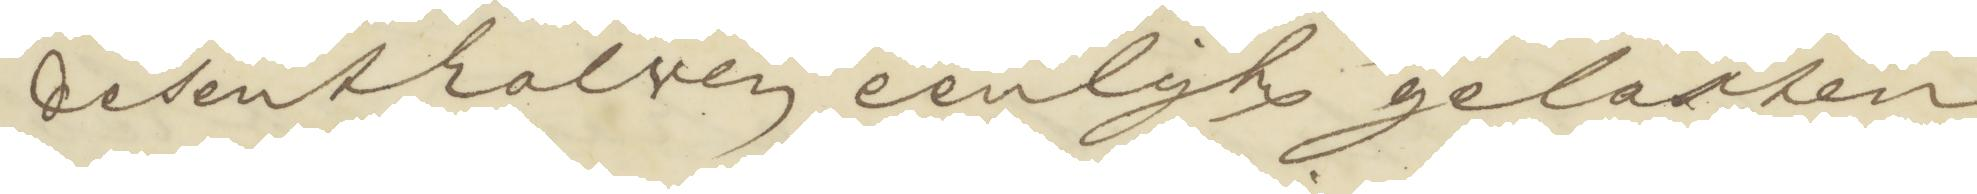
desenthalven eenlijk gelasten
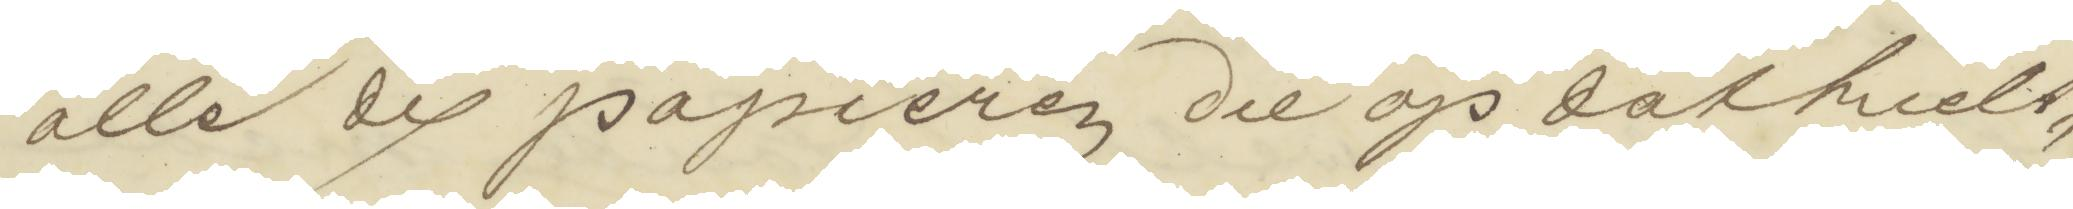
alle de papieren die op dat kielt
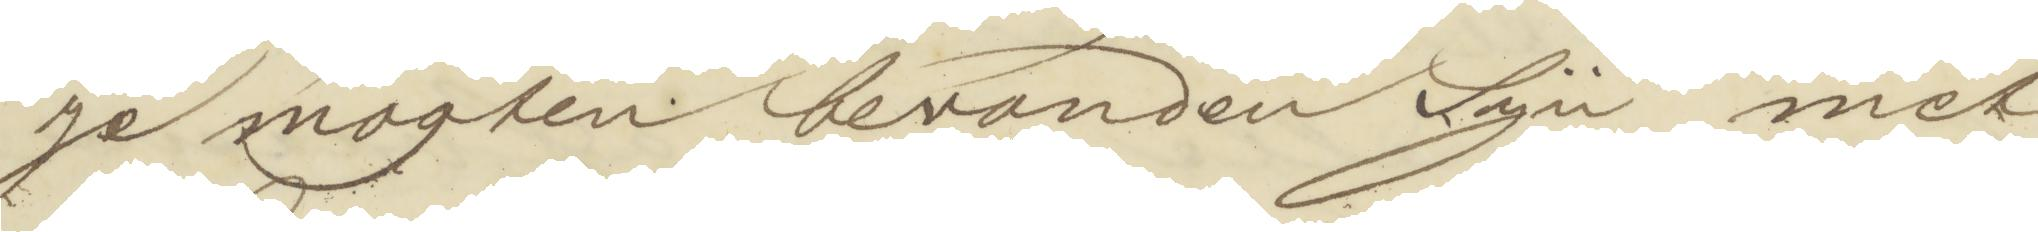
je mogten bevonden sijn met
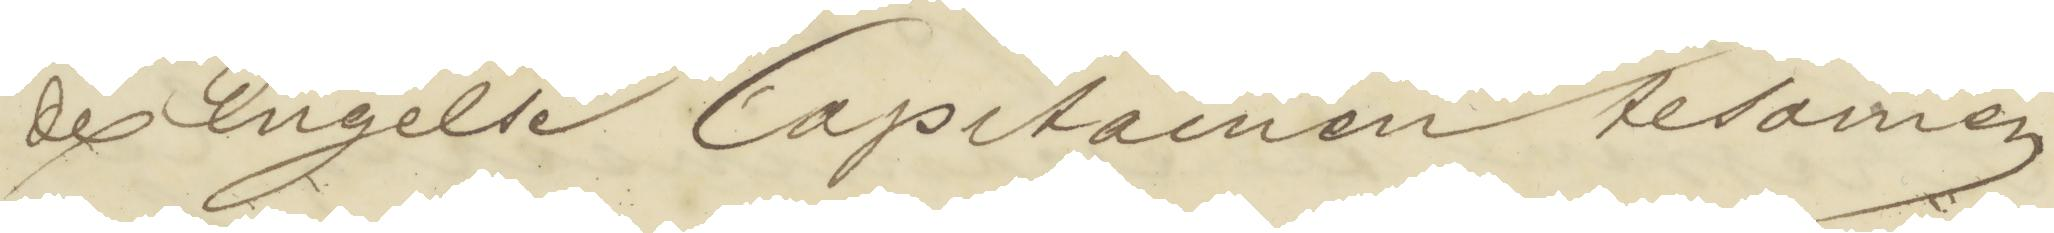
de Engelse Capitainen tesamen
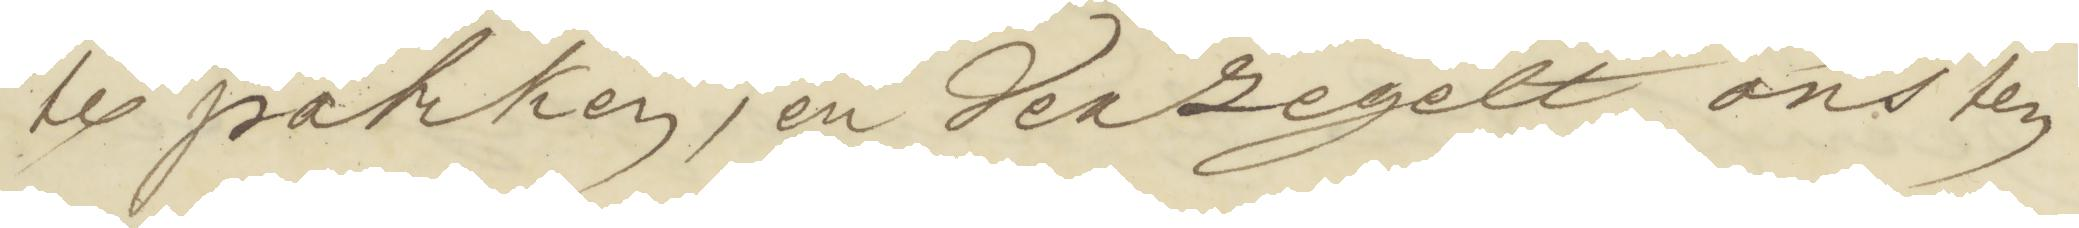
te pakken, en verzegelt ons ten
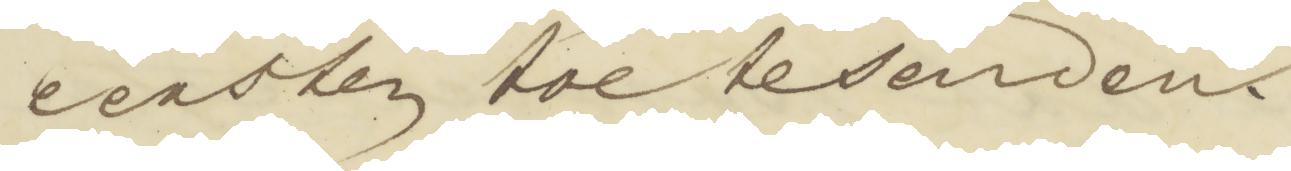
eersten toe te senden.
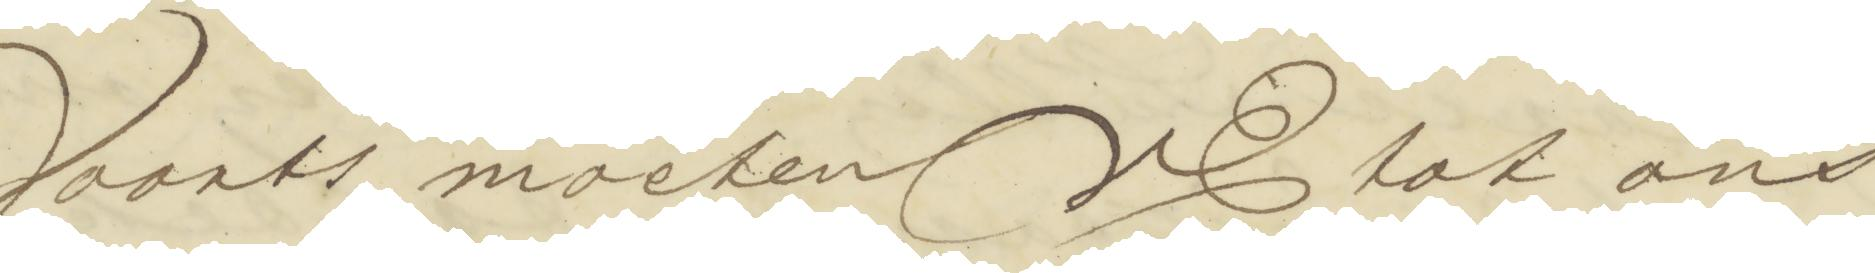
Voorts moeten VE tot ons
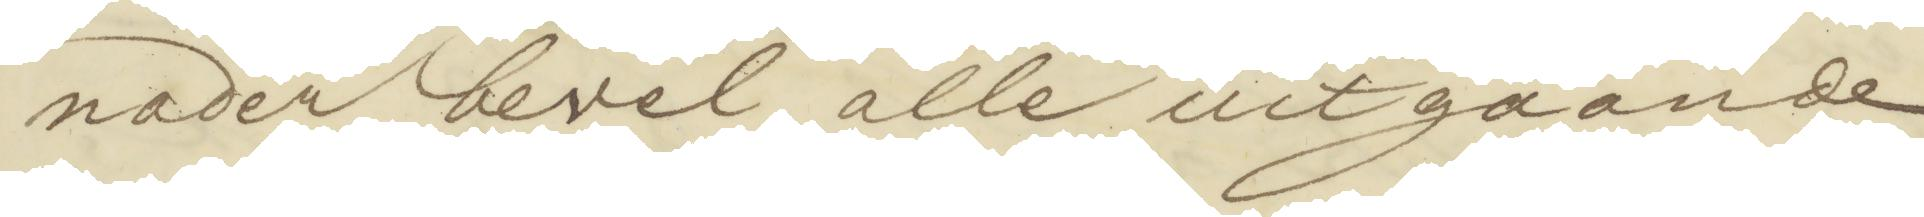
nader bevel alle uitgaande
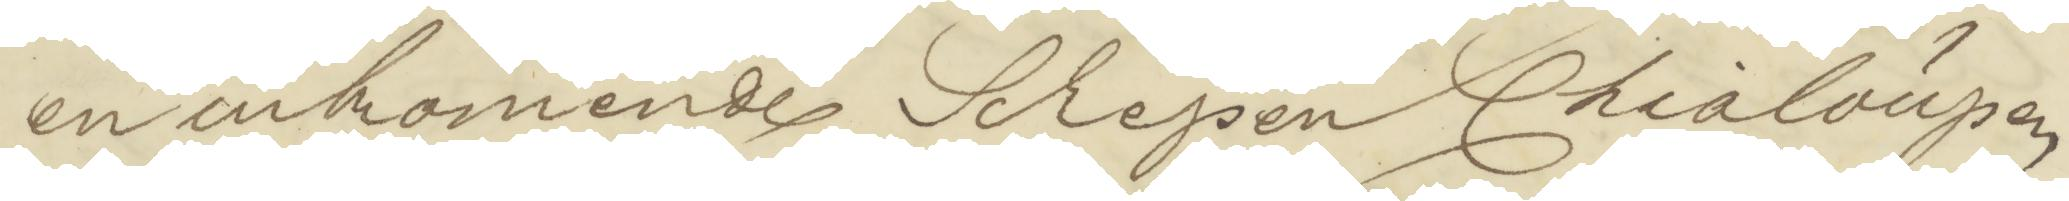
en inkomende schepen Chialoupen
